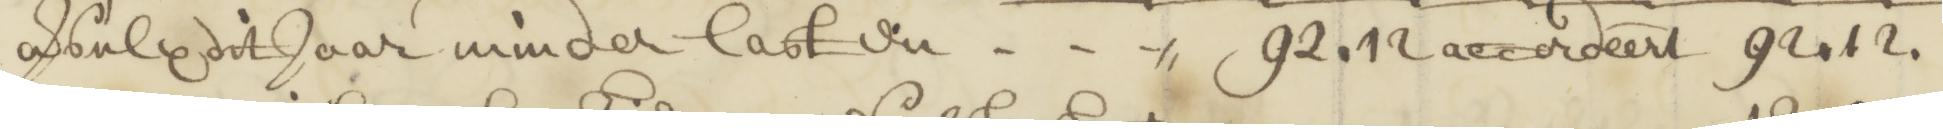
oversulx dit Jaar minder lasten - - -„ 92.12 accordeert 92.12.
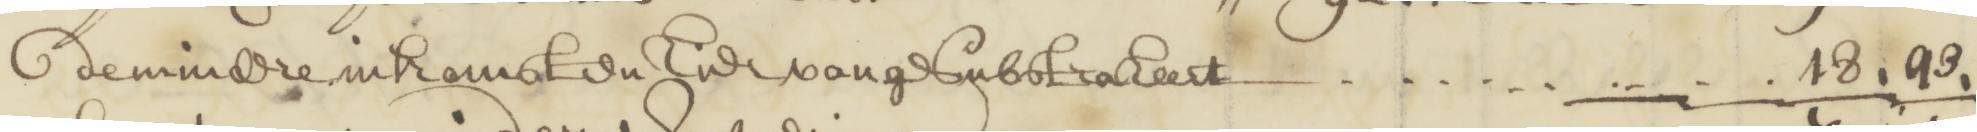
de mindere inkomsten hier van gesubstraheert . . . . . . . . . . 18. 43.
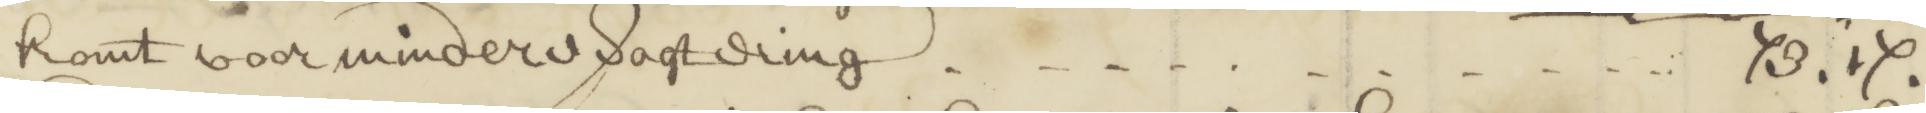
komt voor mindere veragtering . - - - . - - - - - . . 73.17.
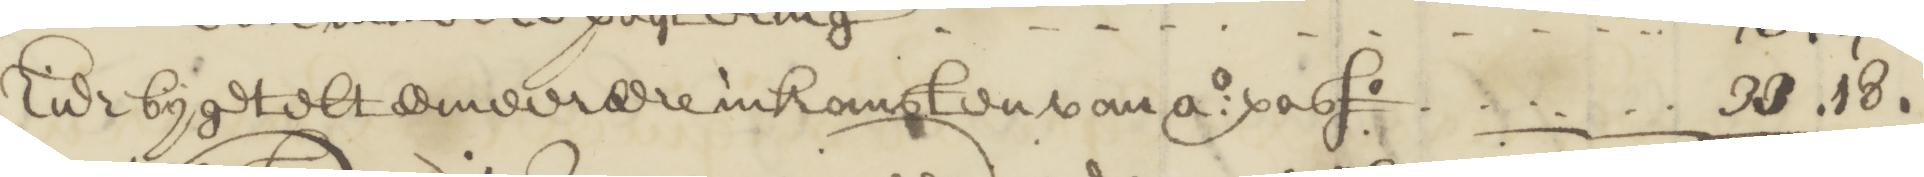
hierbij getelt demeerdere inkomsten van a:o pass=o . . . . . . 33. 18.
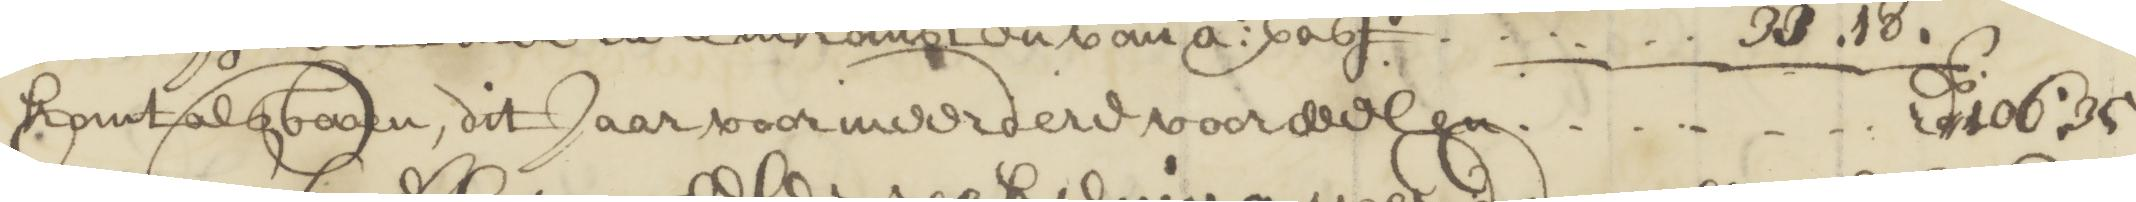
komt als boven, dit Jaar voor meerdere voordeelen . - - . - - - . rd„s 106: 35
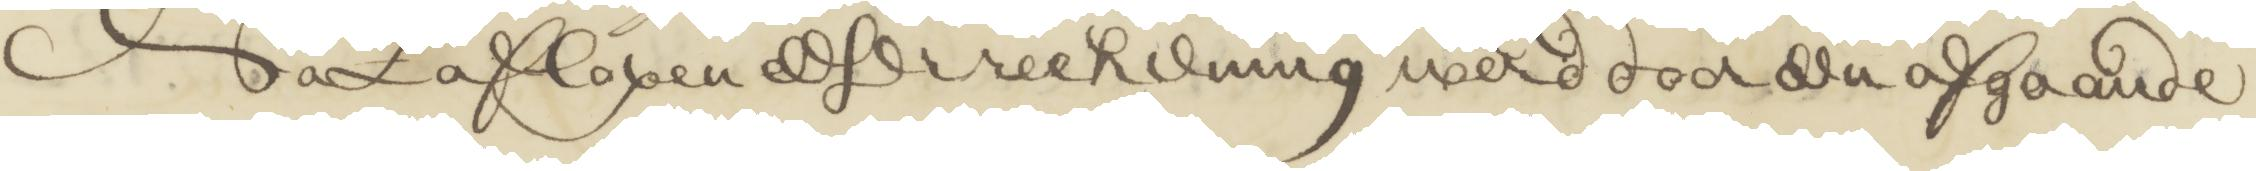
Na't aflopen deser reekening werd door den afgaande
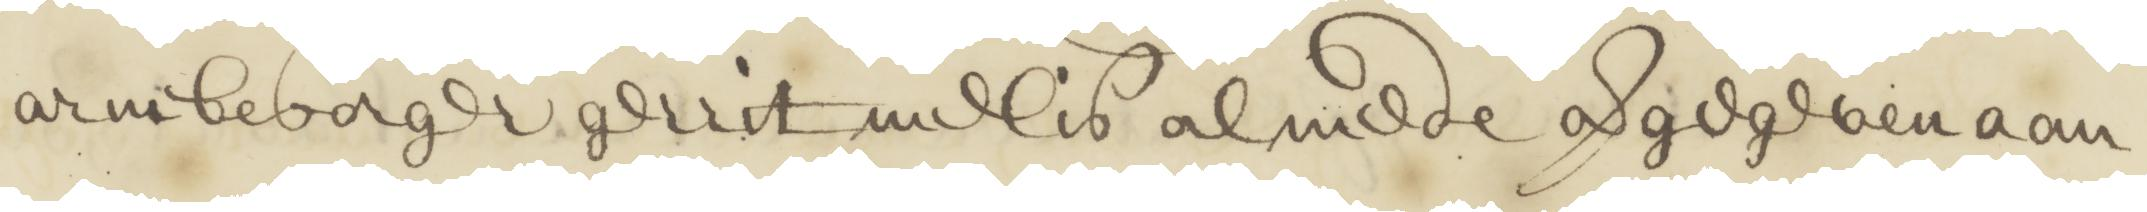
armbesorger gerrit melis almede overgegeven aan
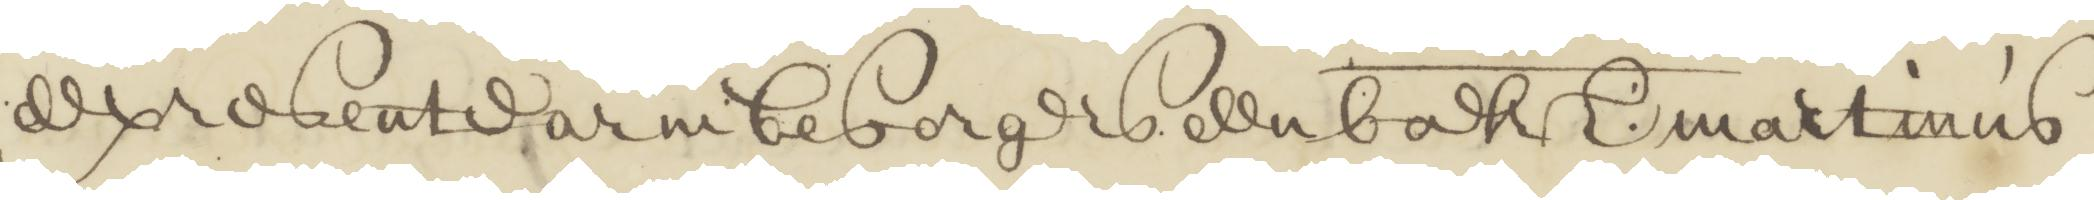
de presente armbesorgers den boekh: martinus
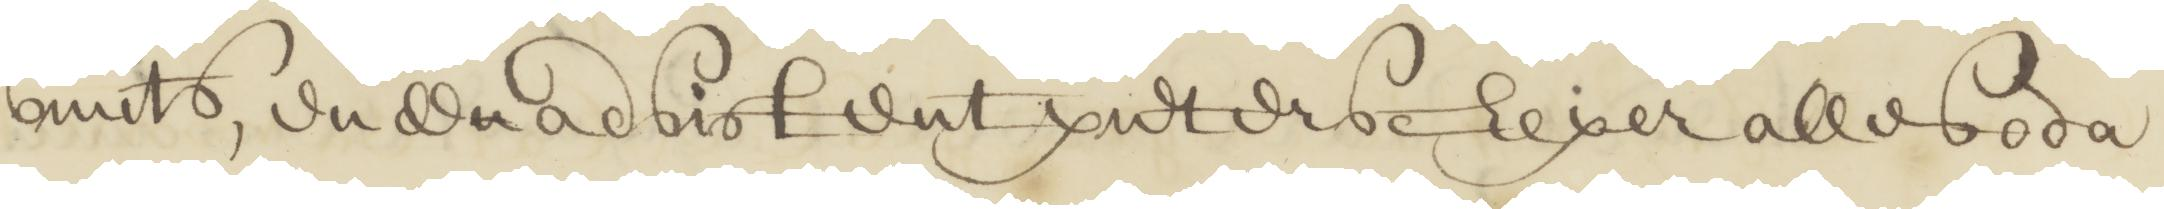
smits, en den adsistent pieter scheper alle soda
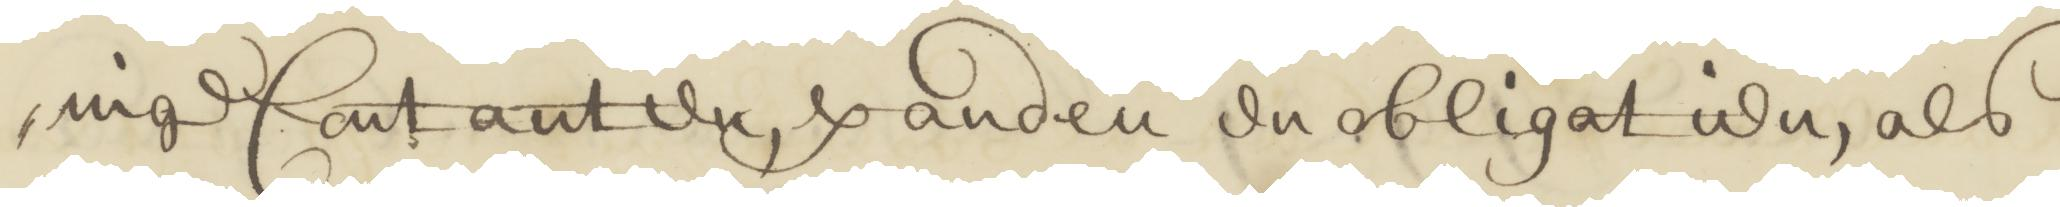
„nige Contanten, panden en obligatien, als
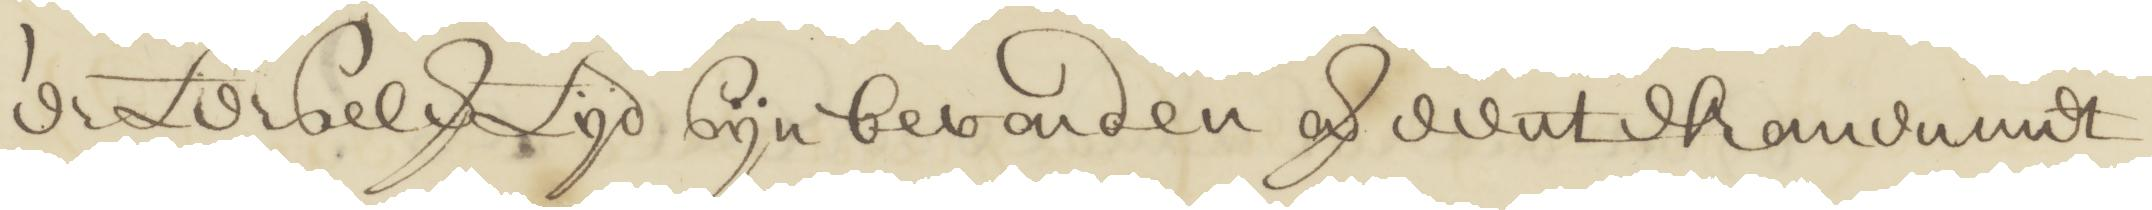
'er terselver tijd sijn bevonden over een te komen met
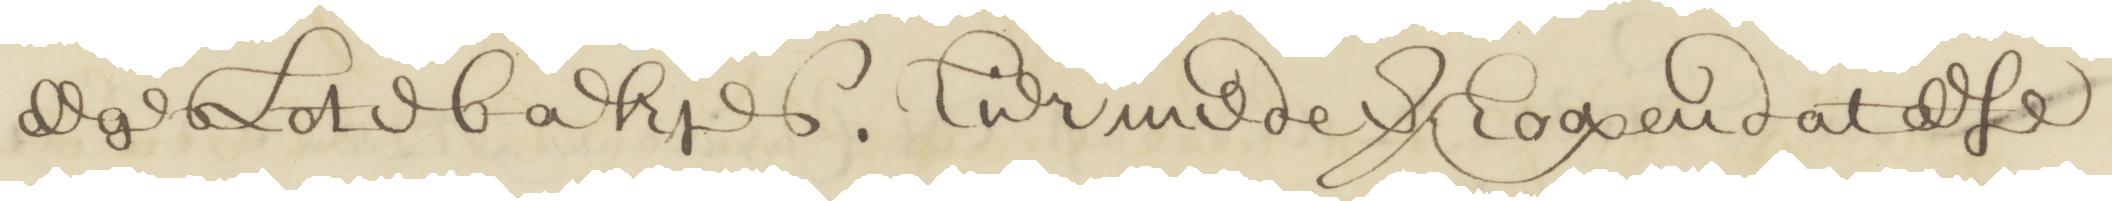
de gesloteboekjes. hier mede verhoopen dat dese
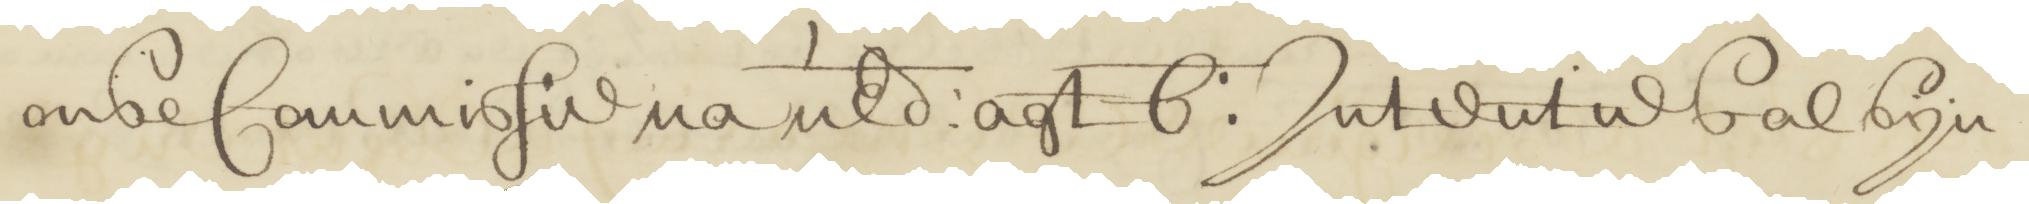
onse Commissie na uEd: agtb: Jntentie sal sijn
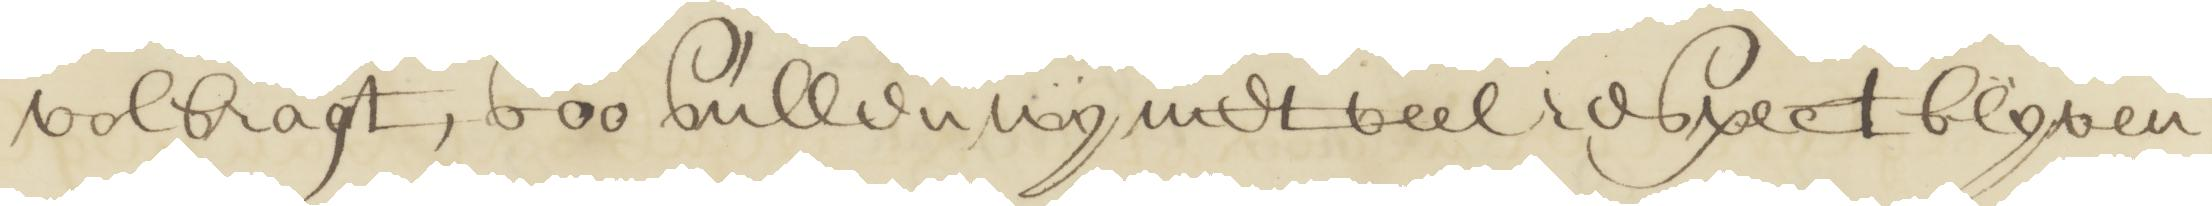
volbragt, soo sullen wij met veel respect blijven
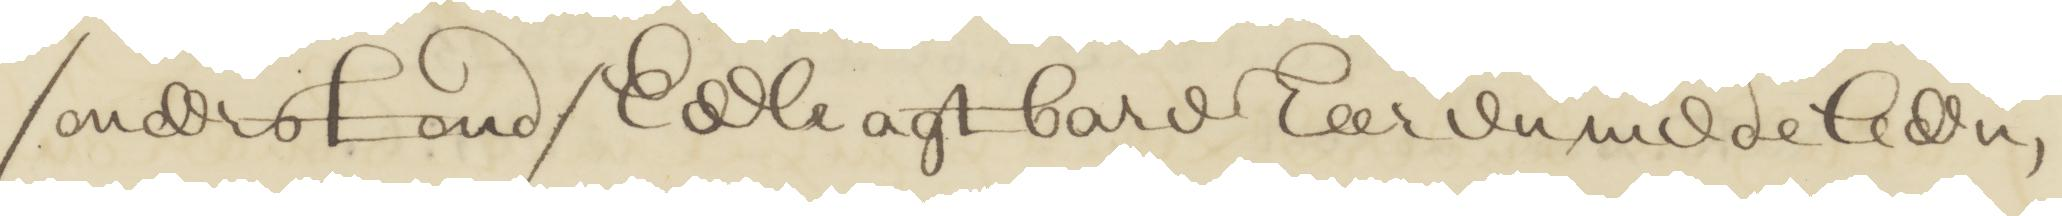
/onderstond/ Edele agtbare heer en mede leden,
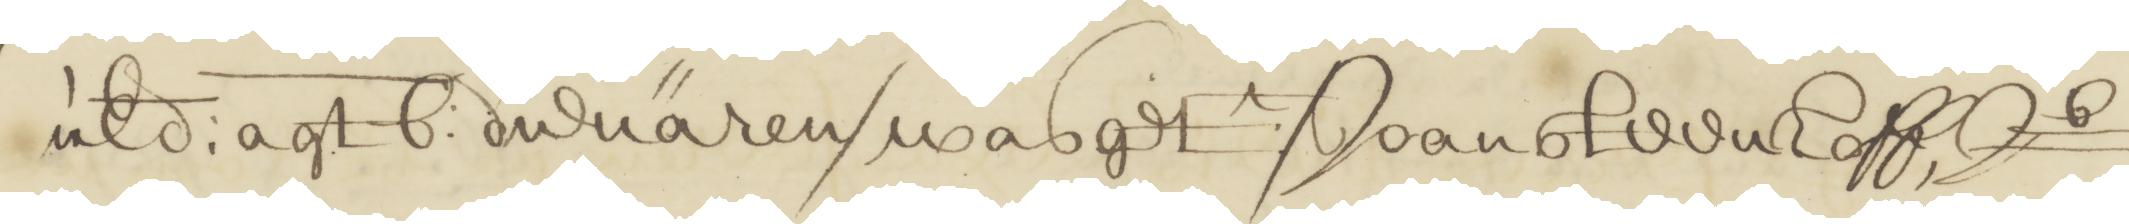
uEd: agtb: dienaren /was get:t/ Joan steenhoff, J=b
